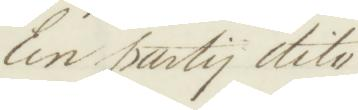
Een partij dito
